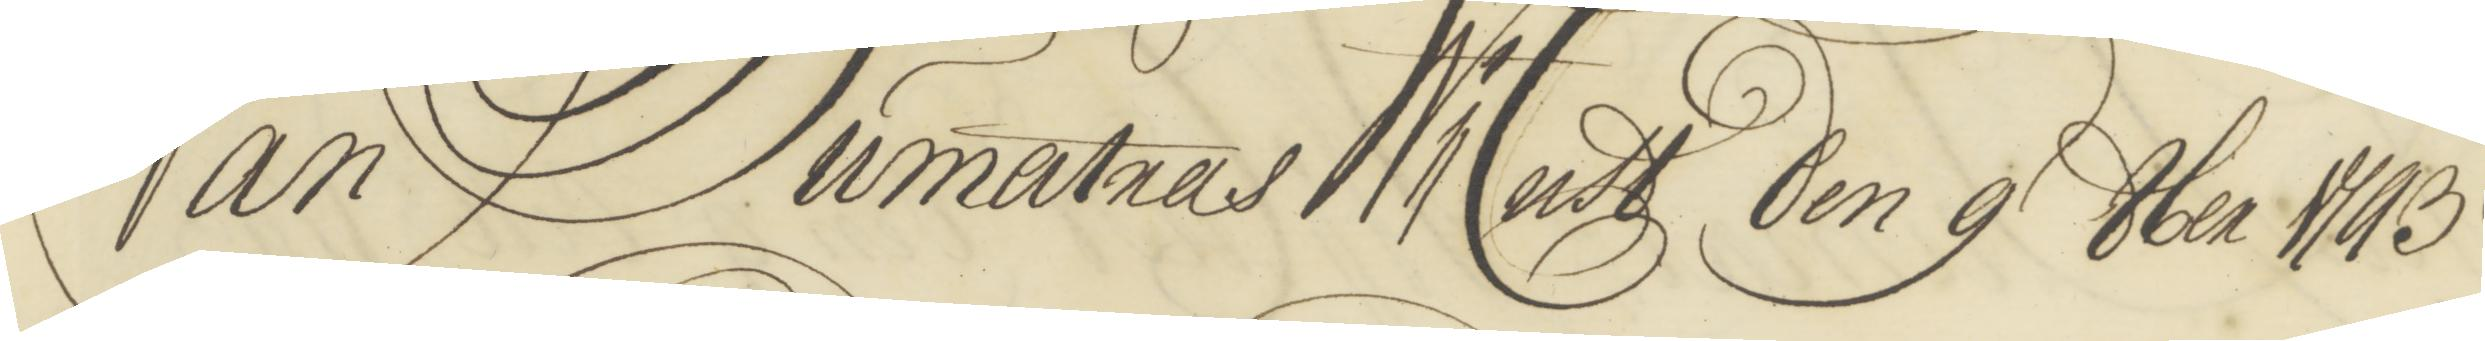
Van Sumatras W„t Cust den 9' 8ber 1743
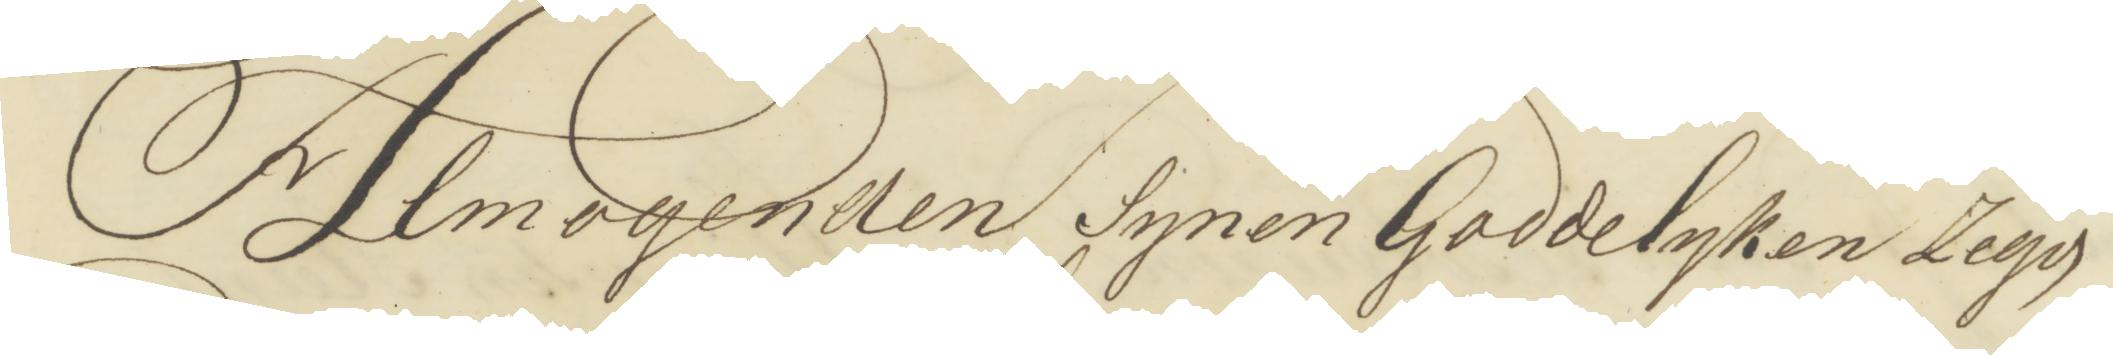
Almogenden synen Goddelyken zegen
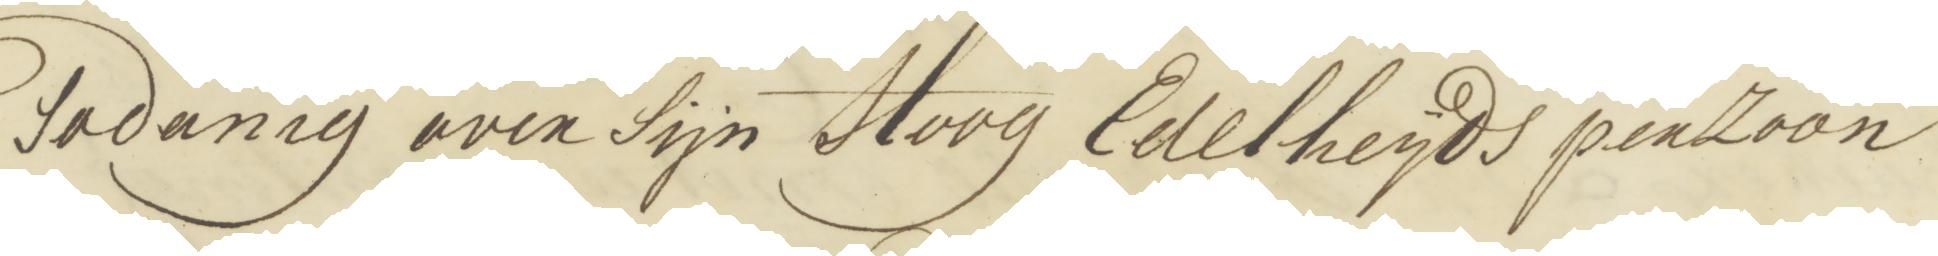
sodanig over sijn Hoog Edelheijds perzoon
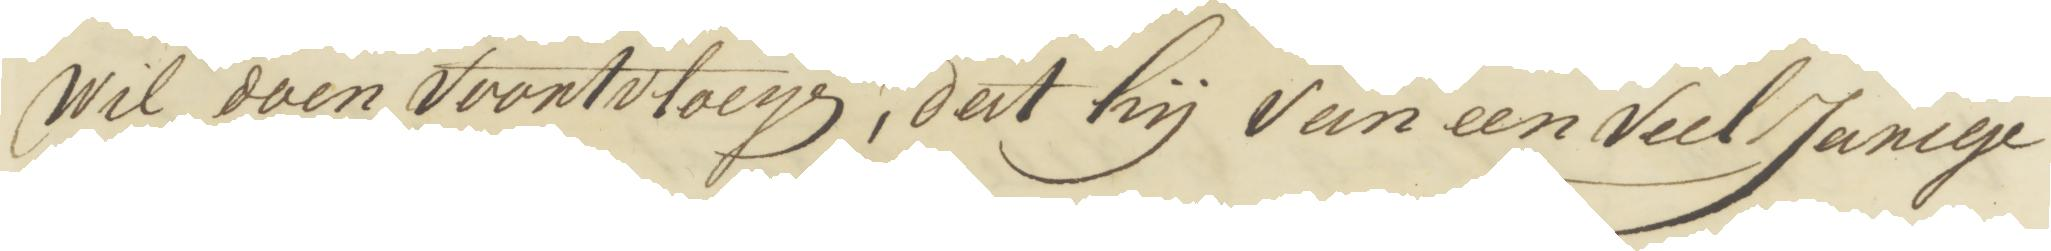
wil doen voortvloeyen, dat hij van een veel Jarige
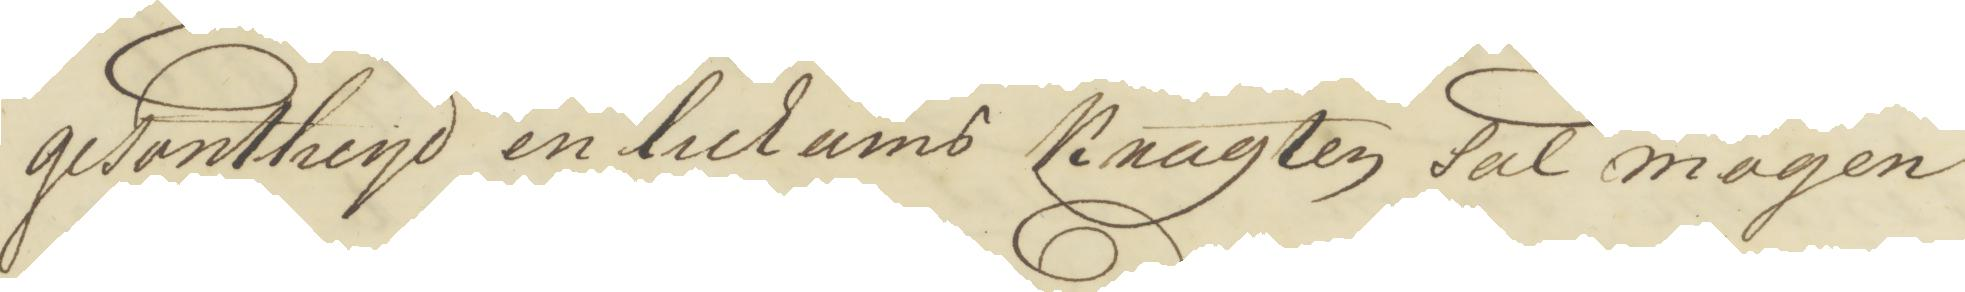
gesontheijd en lichams kragten sal mogen
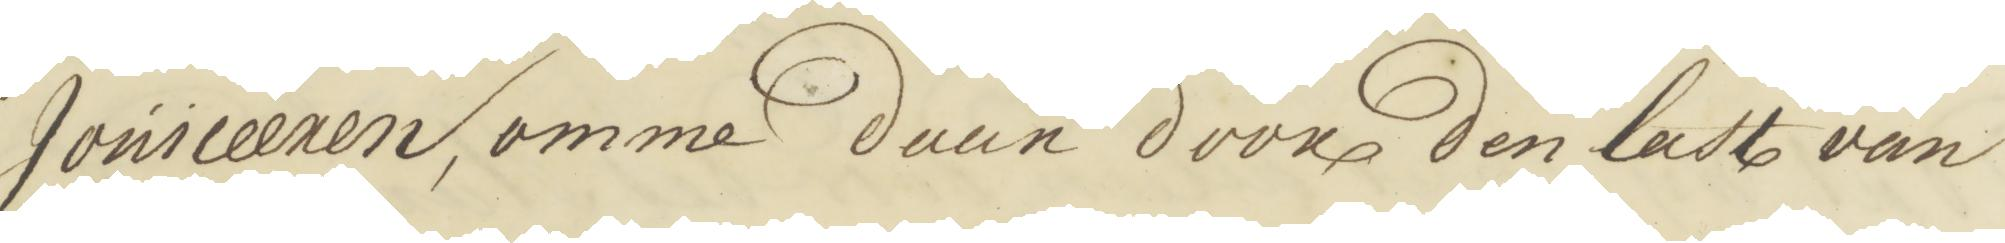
Jouiceeren, omme daar door den last van
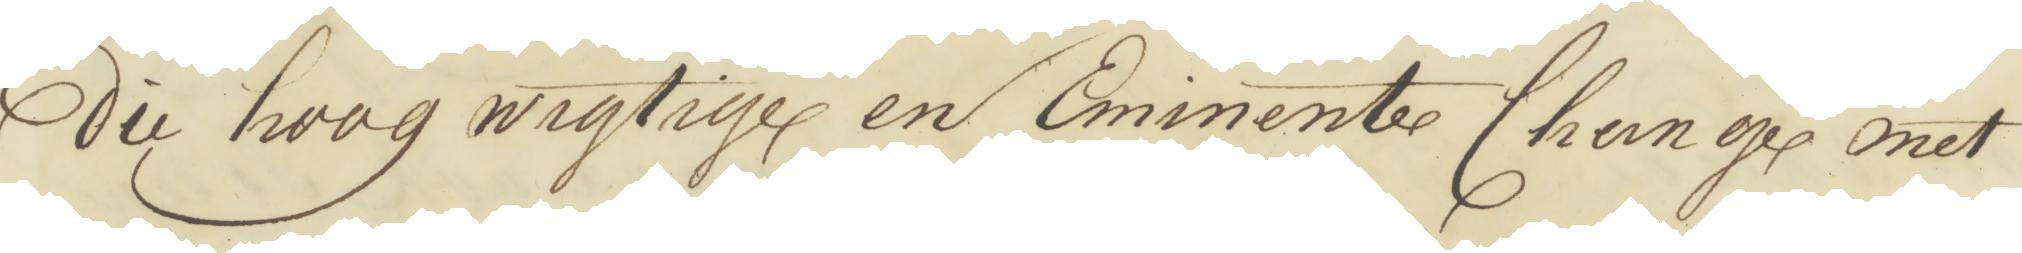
die hoog wigtige en Eminente Chunge met
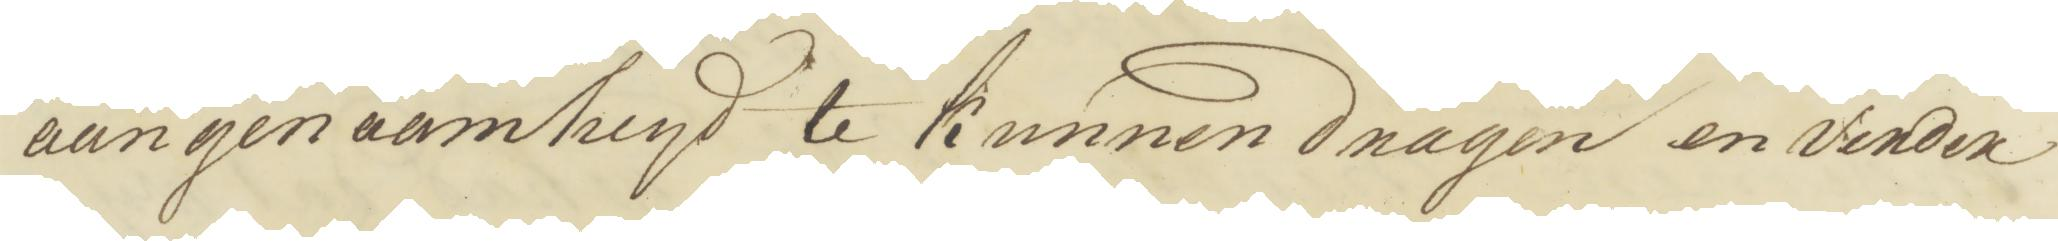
aangenaamheyd te kunnen dragen en vinden
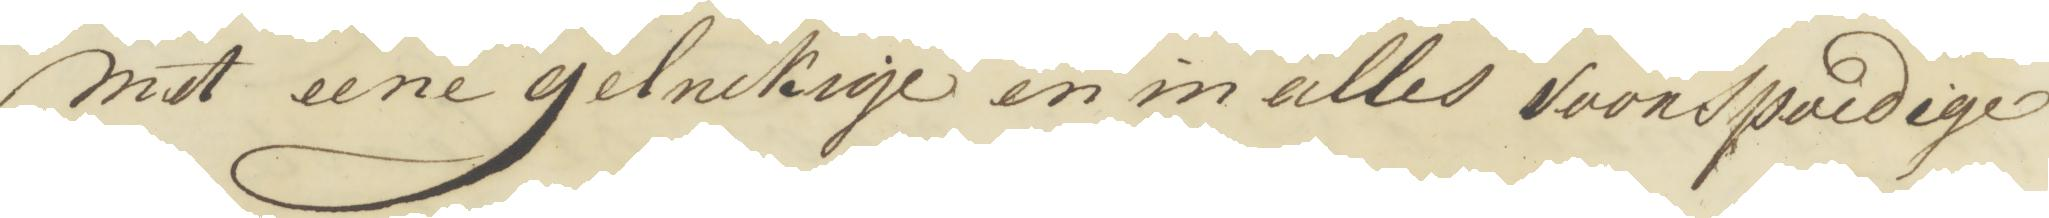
met eene geluckige en in alles voorspoedige
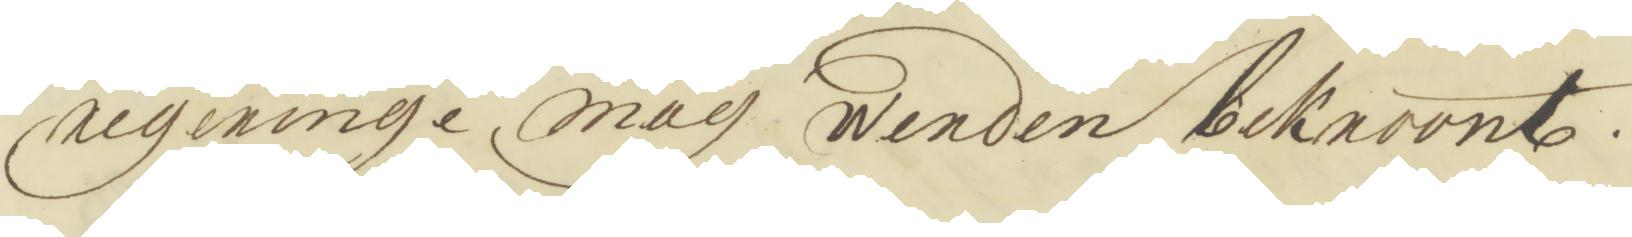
regeringe mag werden bekroont.
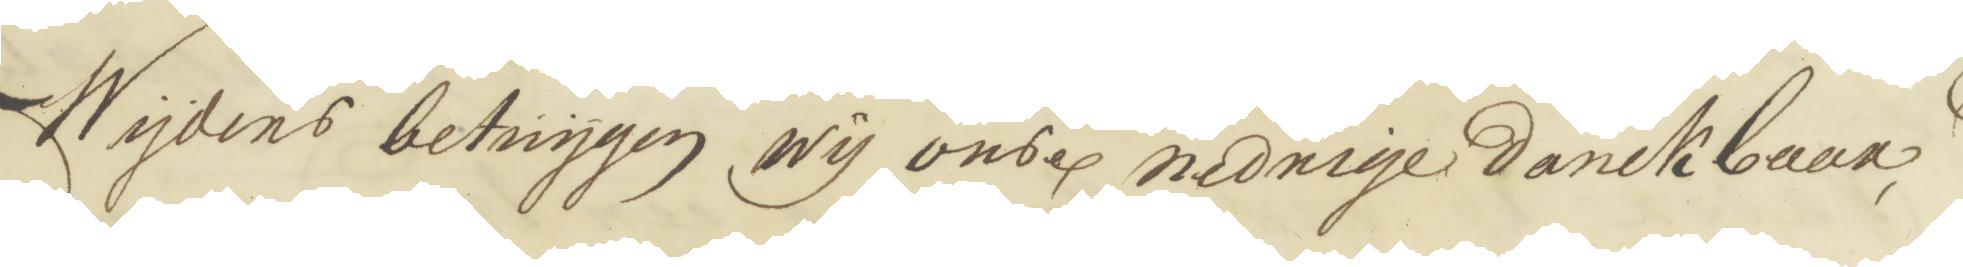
Wijders betuijgen wij onse nedrige danckbaar,
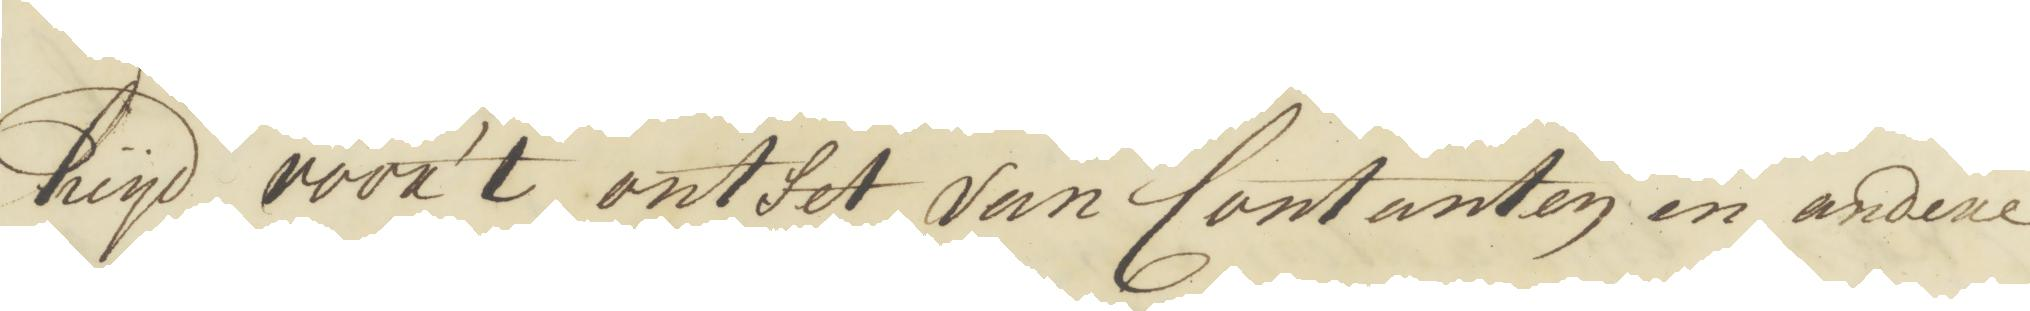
heijd voor ’t ontset van Contanten en andere
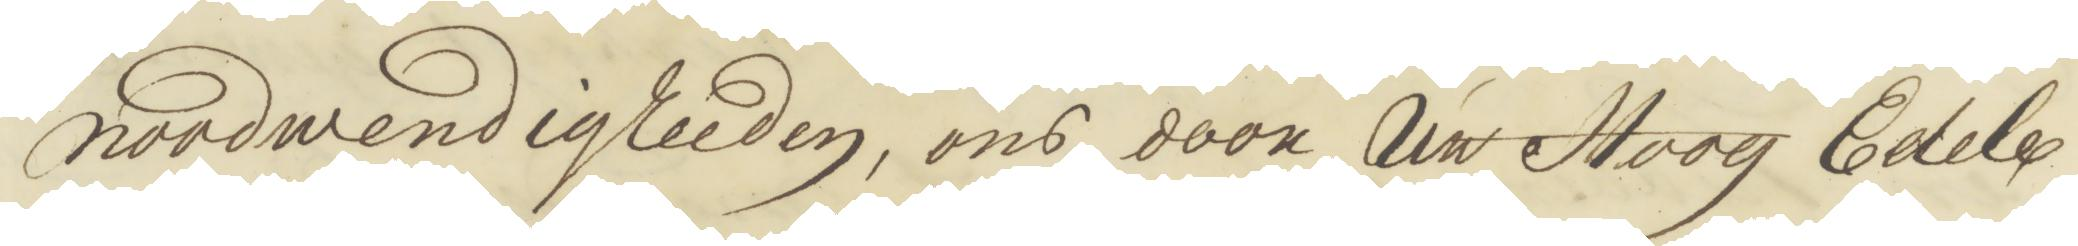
noodwendigheeden, ons door uw Hoog Edele
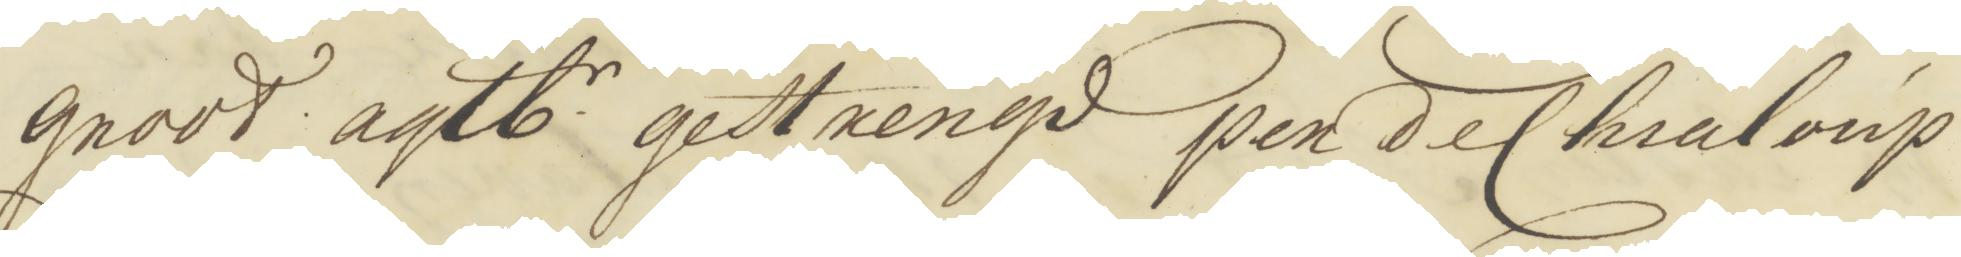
Groot agtb:r gestrenge per de Chialoup
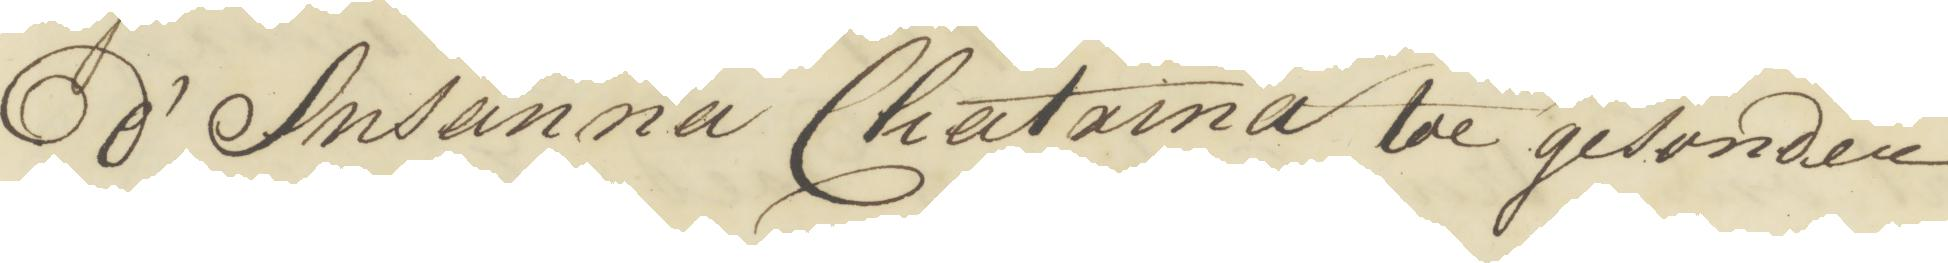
d’ Susanna Chatrina toe gesonden
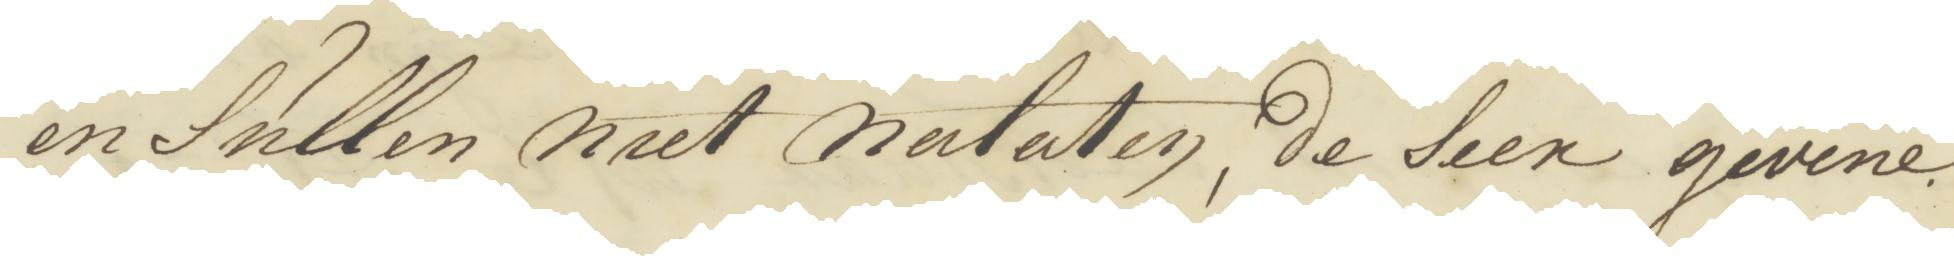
en sullen niet nalaten, de seer gevene,
